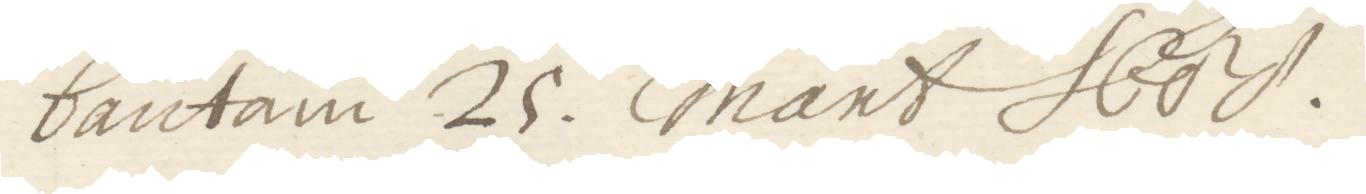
bantam 25. Mart 1688.
